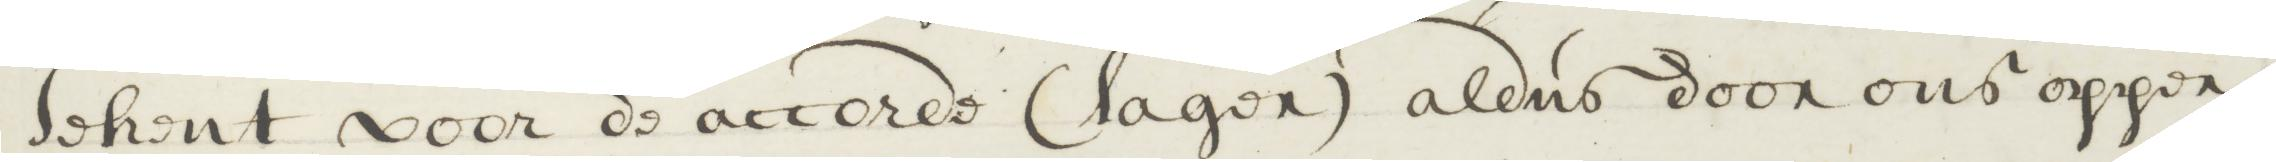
tekent voor de accorde (lager) aldus door ons opper
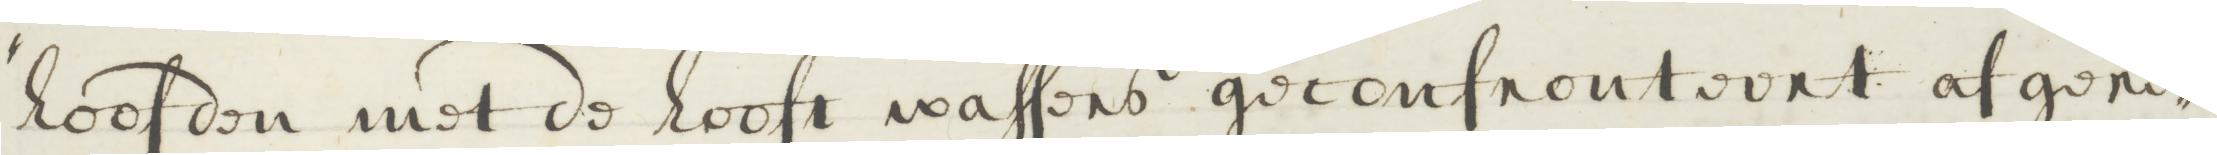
hoofden met de hooft wassers geconfronteert afgere„
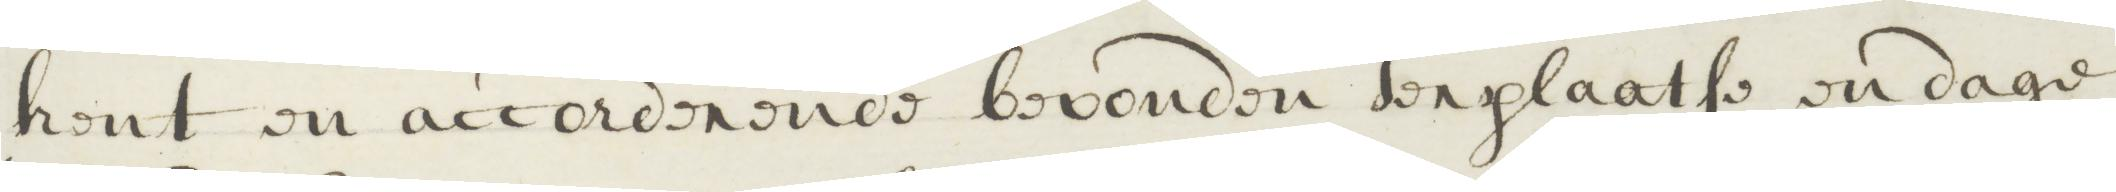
kent en accorderende bevonden terplaatse en dage
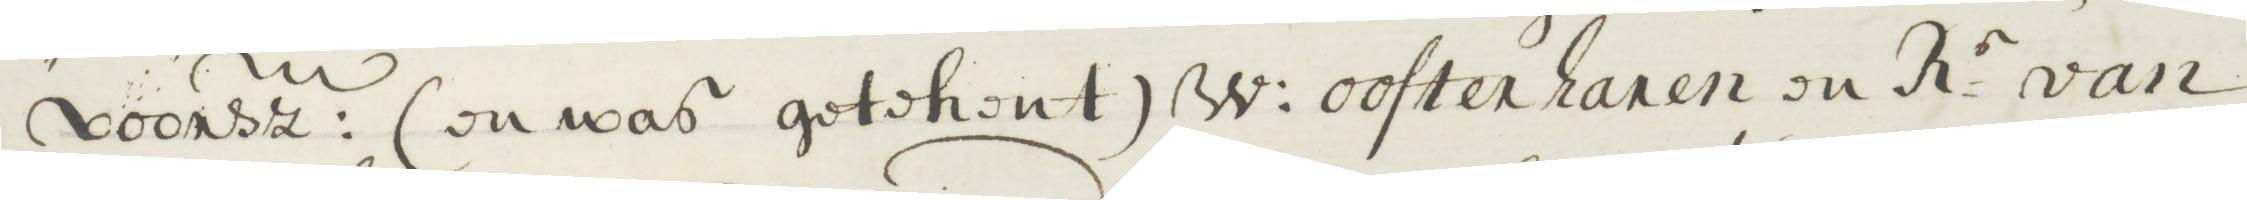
voorsz: (en was getekent) W: oosterharen en R=s van
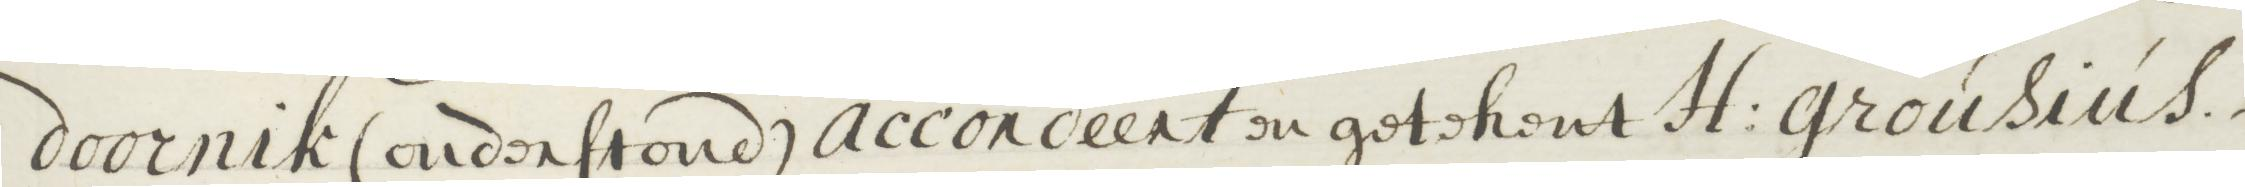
doornik (onderstond) accordeert en getekent H: Grousius.
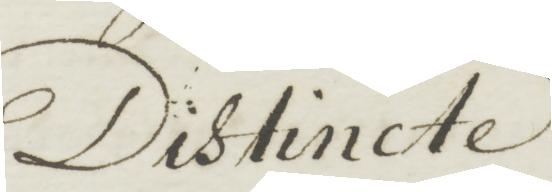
Distincte
